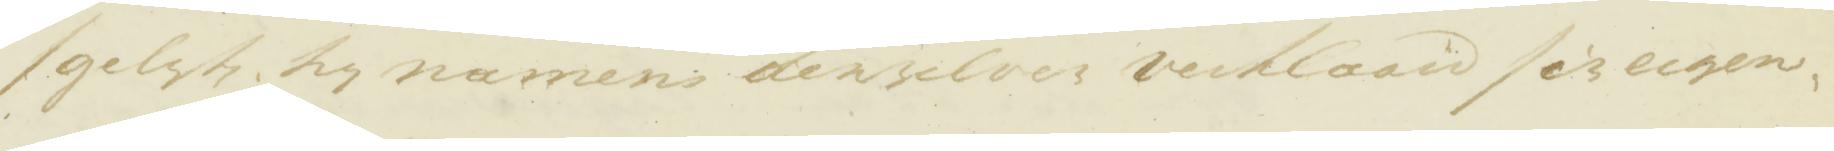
/gelyk hy namens denzelven verklaard / en eigen,
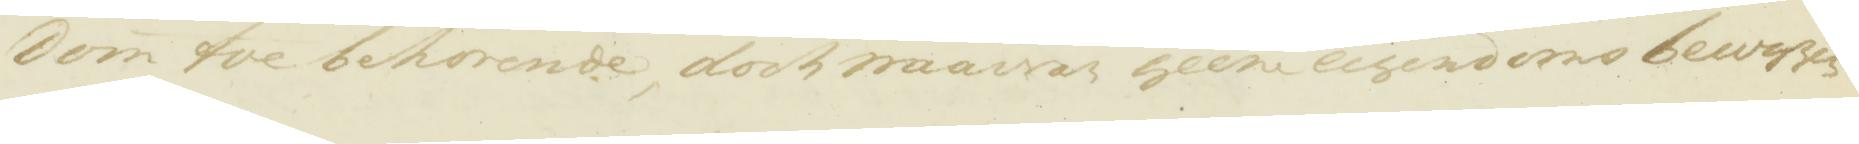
dom toe behorende, doch waarvan geene eigendoms bewyzen
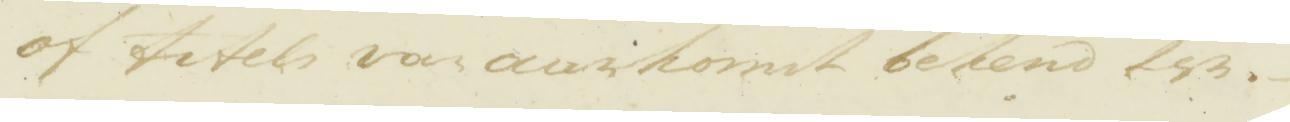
of titels van aankomst bekend zyn
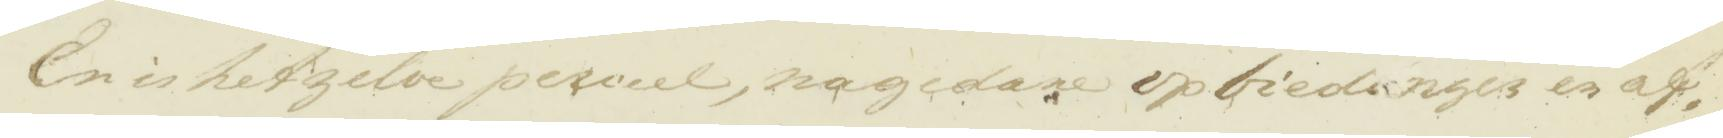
En is hetzelve perceel, nagedane opbiedingen en af„
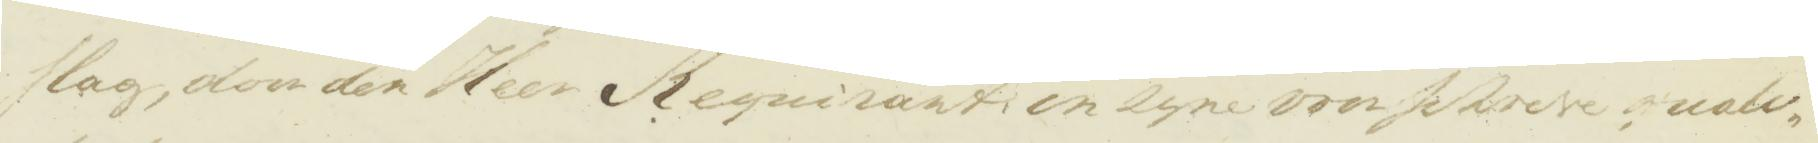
slag, door den Heer Requirant in zyne voorschreve quali„
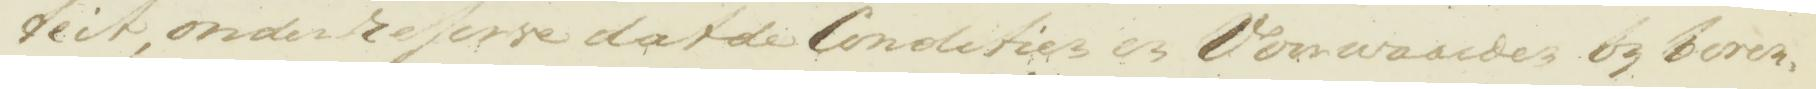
teit, onder reserve dat de Conditien en Voorwaarden by boven,
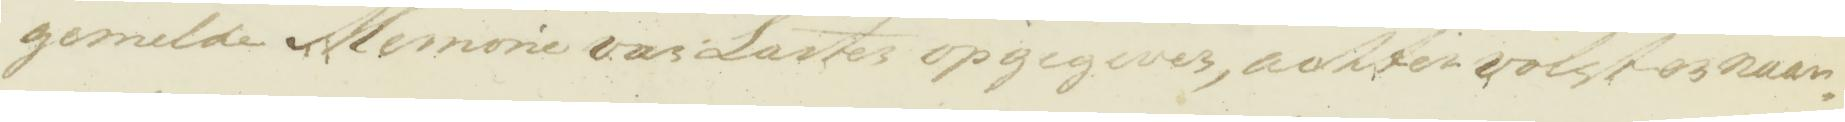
gemelde Memorie van Lasten opgegeven, achter volgt en naar„
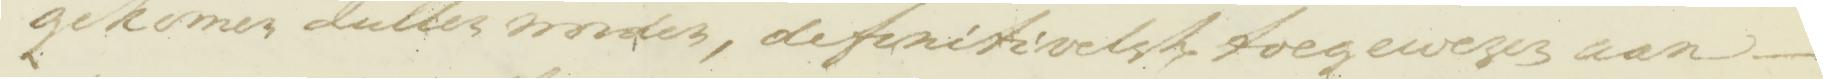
gekomen zullen worden, definitivelyk toegewezen aan
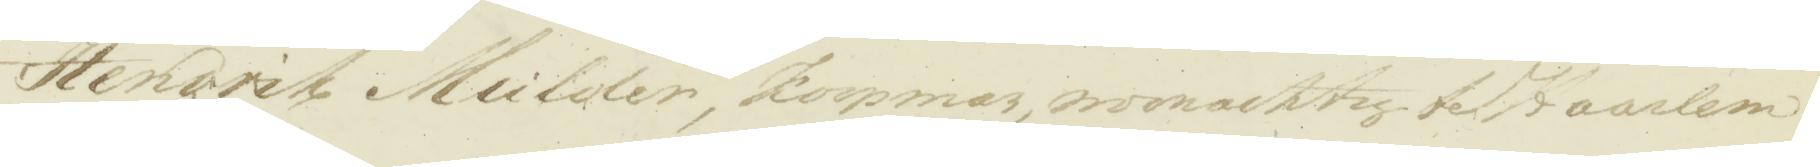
Hendrik Mulder, Koopman, woonachtig te Haarlem
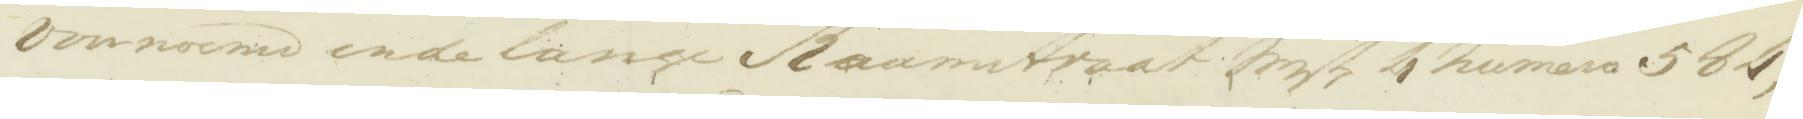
voornoemd in de lange Raamstraat wyk 4 numero 584,
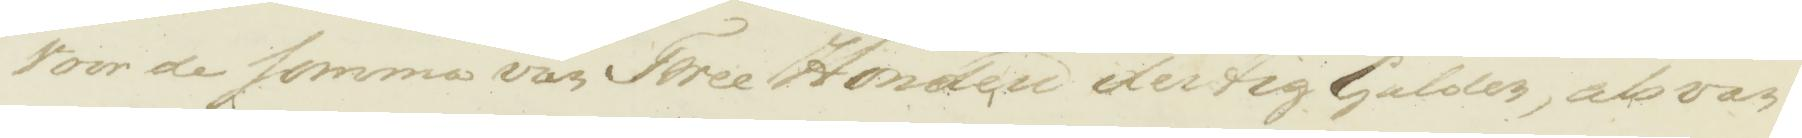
voor de somma van Twee Honderd dertig Gulden, als van
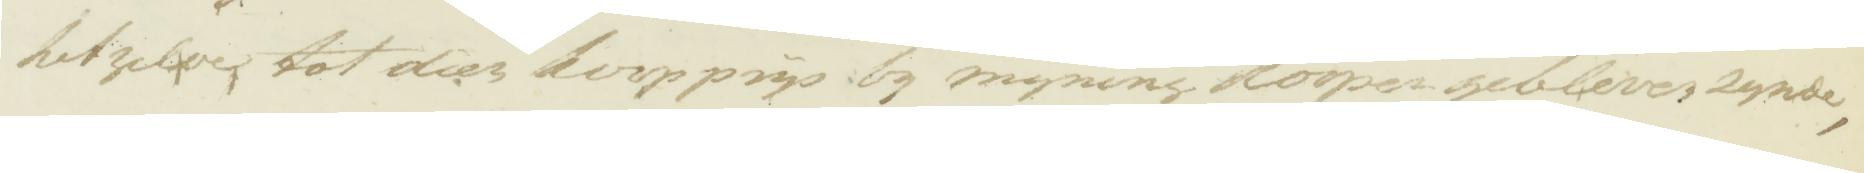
het zelve tot dien koopprijs by myning kooper gebleven zynde,
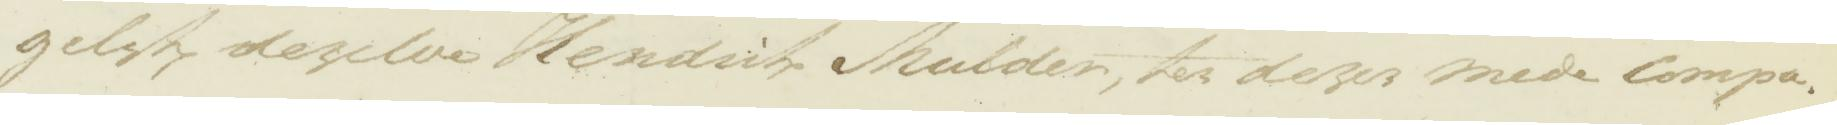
gelyk dezelve Hendrik Mulder, ten dezen mede compa,
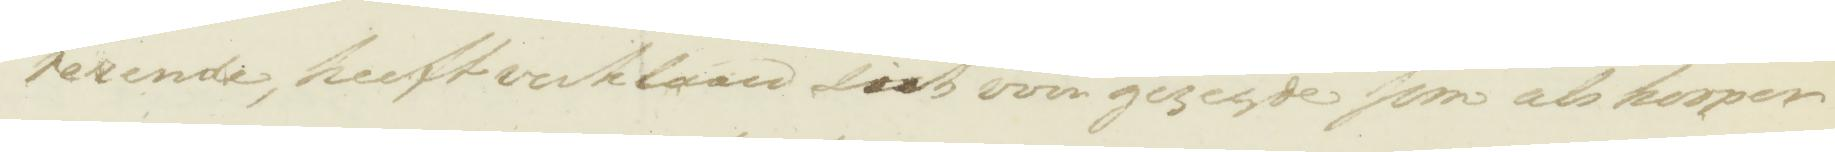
rerende, heeft verklaard zich voor gezegde som als kooper
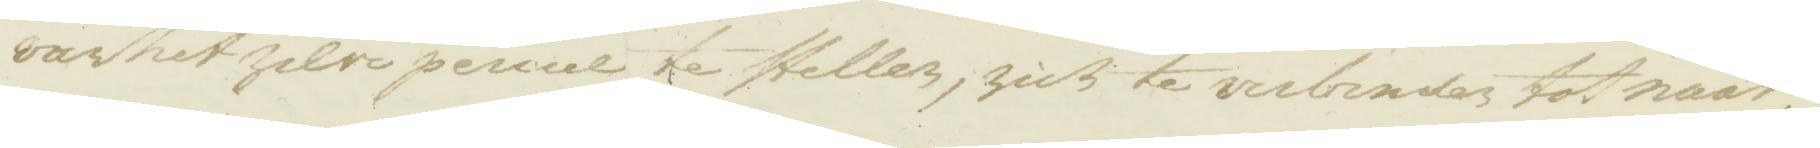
van het zelve perceel te stellen, zich te verbinden tot naar,
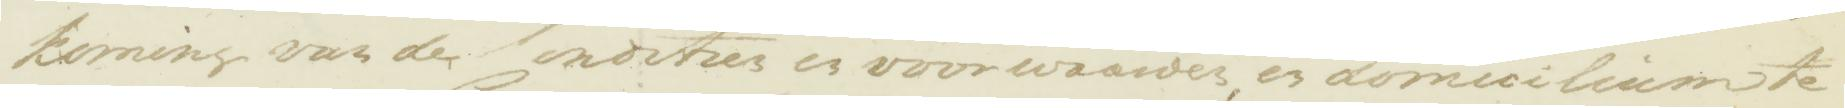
koming van de Conditien en voorwaarden, en domicilium te
